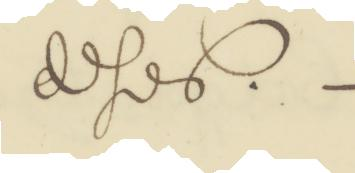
deses._
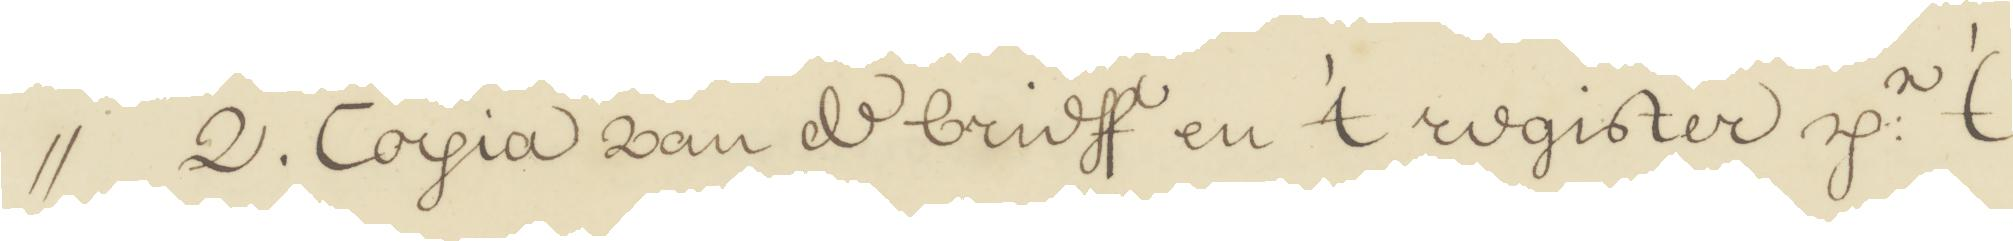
„ 2. Copia van de brieff en ’t register p:r ’t
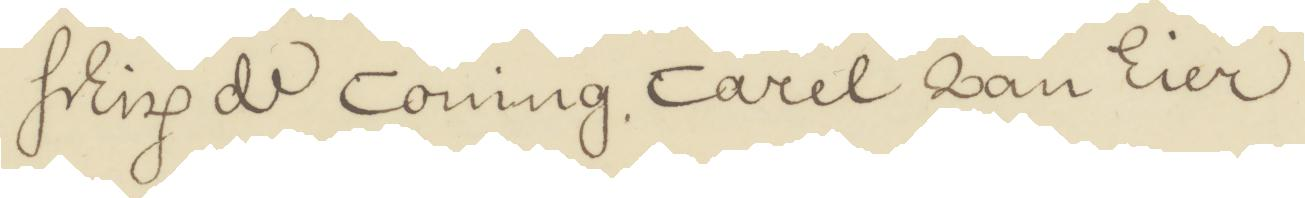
schip de Coning Carel van hier
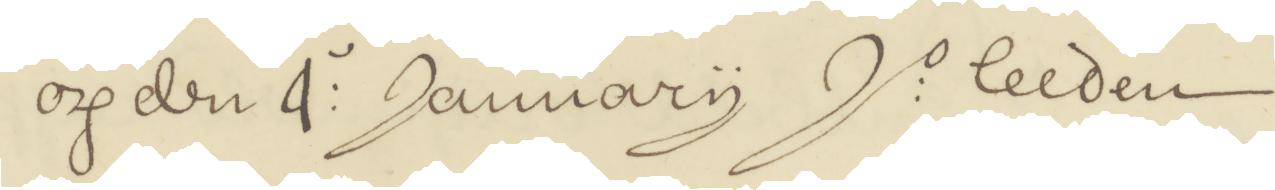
op den 4:' Januarij J:o leeden
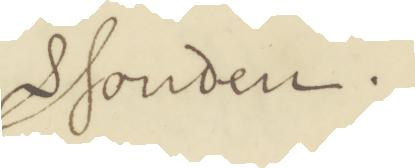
versonden.
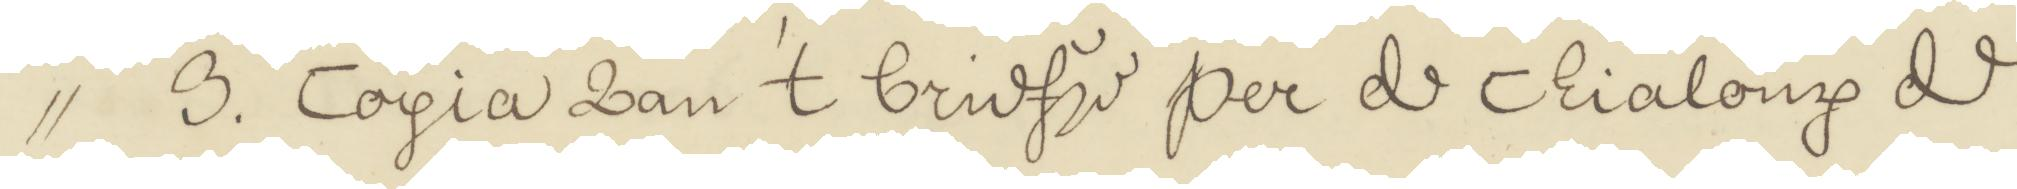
„ 3. Copia van ’t briefje per de chialoup de
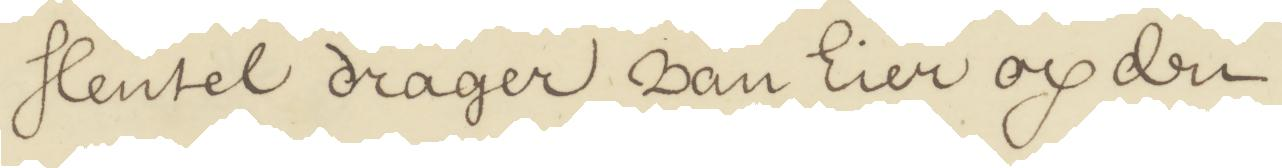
sleutel drager van hier op den
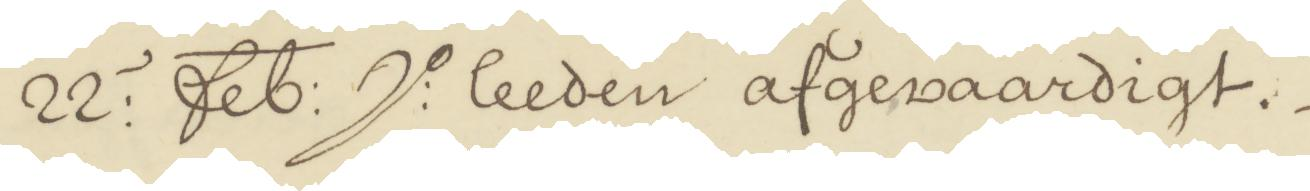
22:' feb: J:o leeden afgevaardigt._
